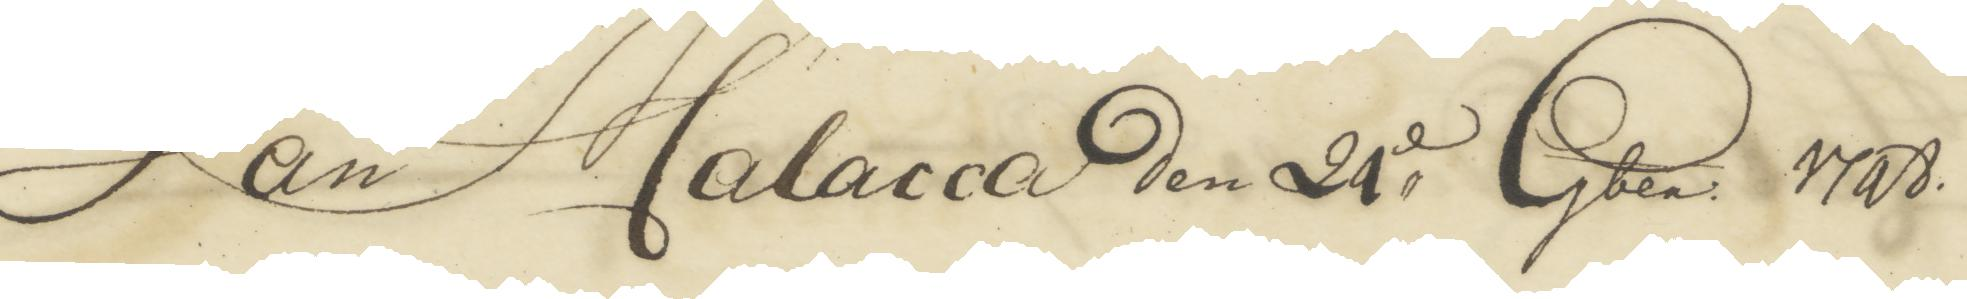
Van Malacca den 24„e 9ber: 1748.
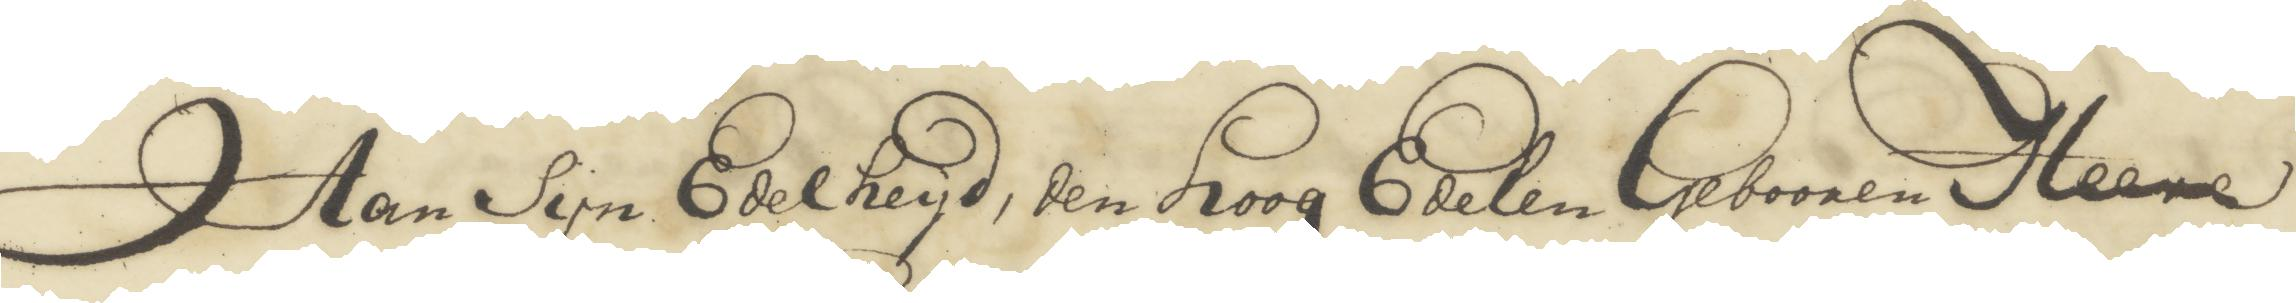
Aan sijn Edelheijd, den hoog Edelen Gebooren Heere
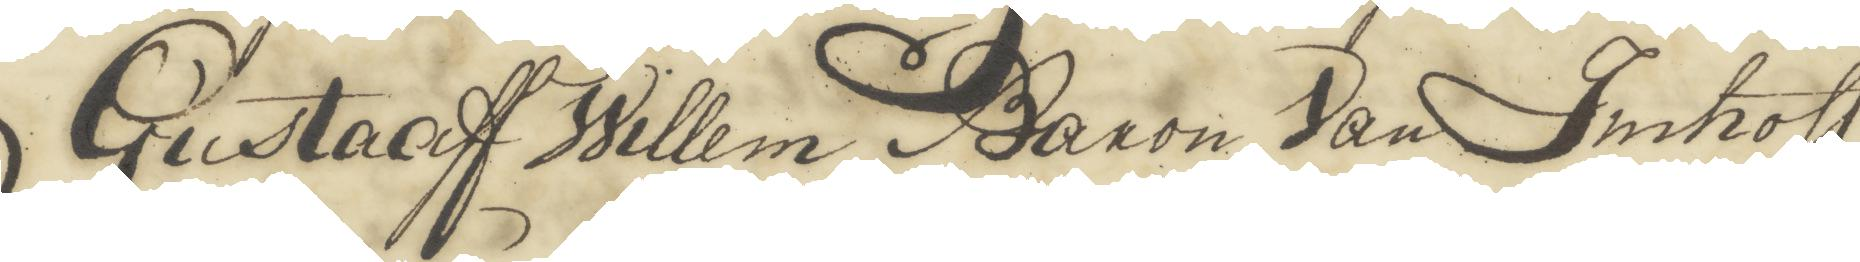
Gustaaff Willem Baron van Jmhoff
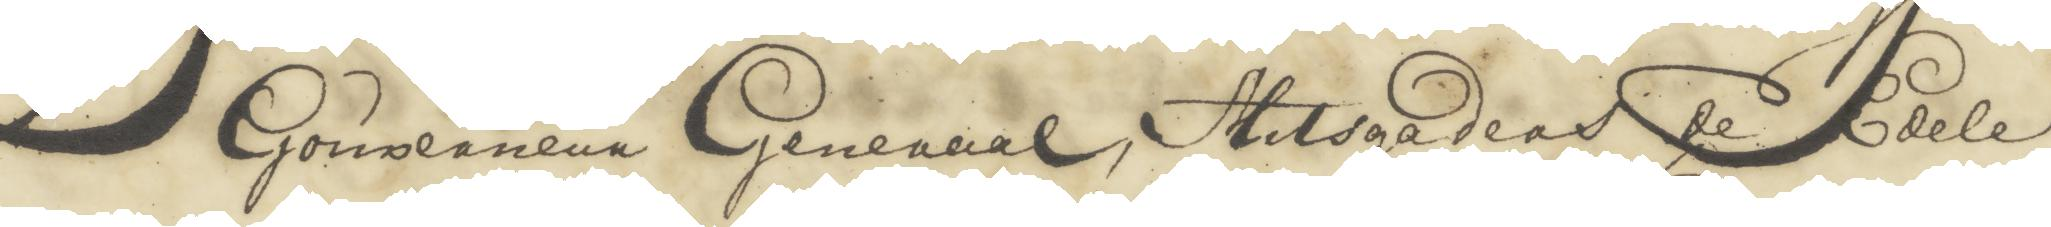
Gouverneur Generaal, Mitsgaders de Edele
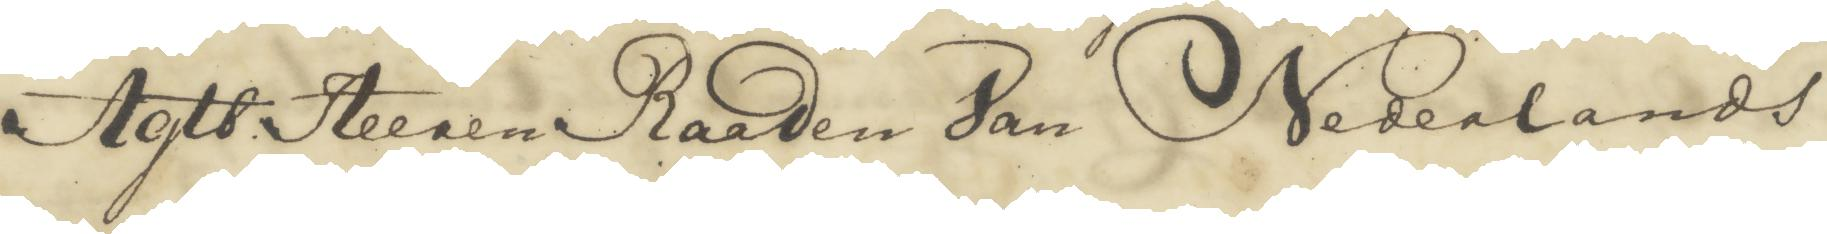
Agtb Heeren Raaden van Nederlands
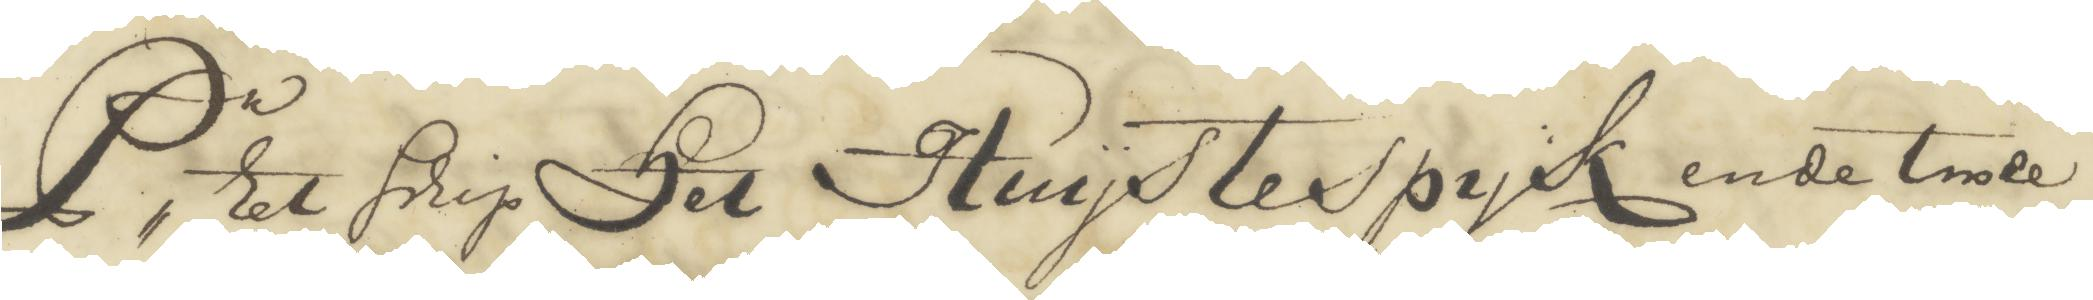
P„r het schip Het Huijs te spijk ende twee
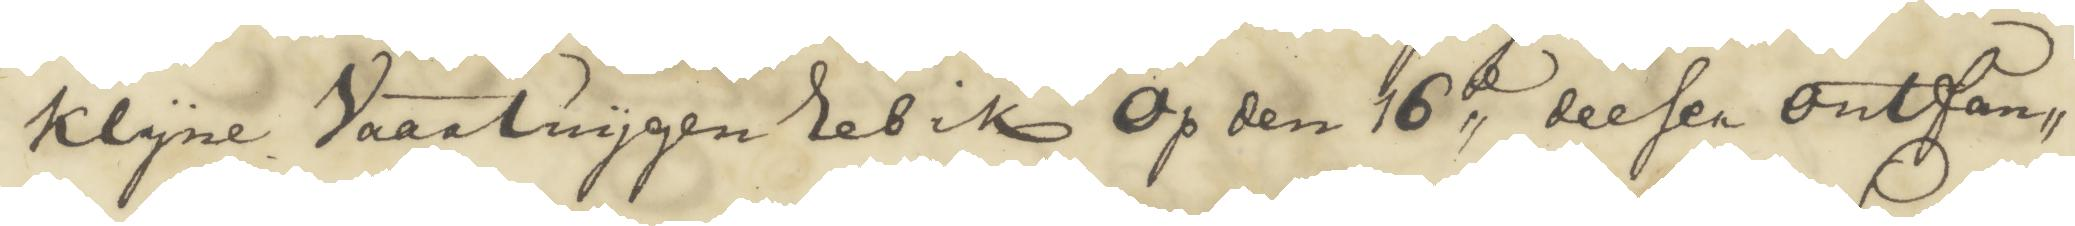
klijne vaartuijgen heb ik op den 16„e deeser ontfan„
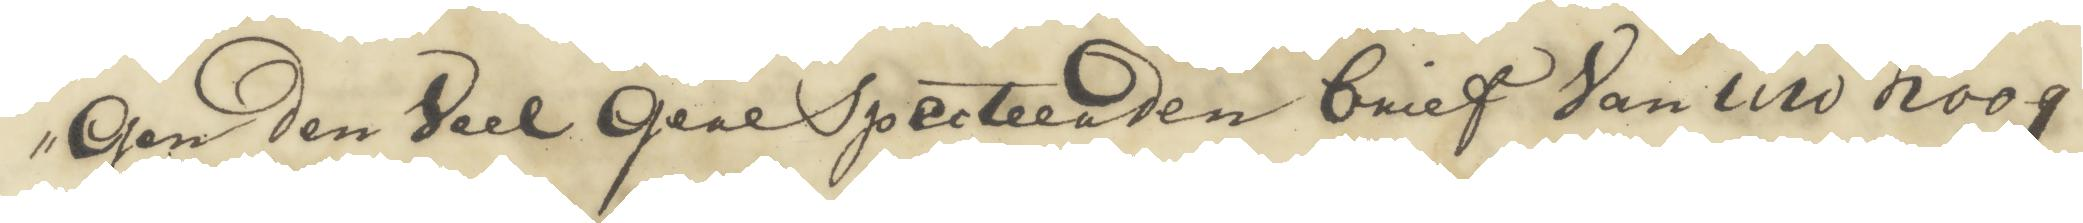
„gen den veel gerespecteerden brief van uw hoog
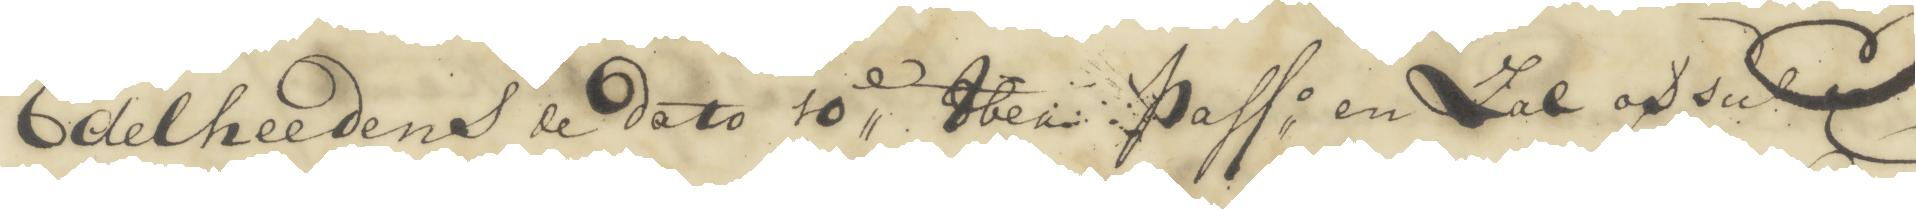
Edelheedens de dato 10„e 8ber pass„o en zal oversulx
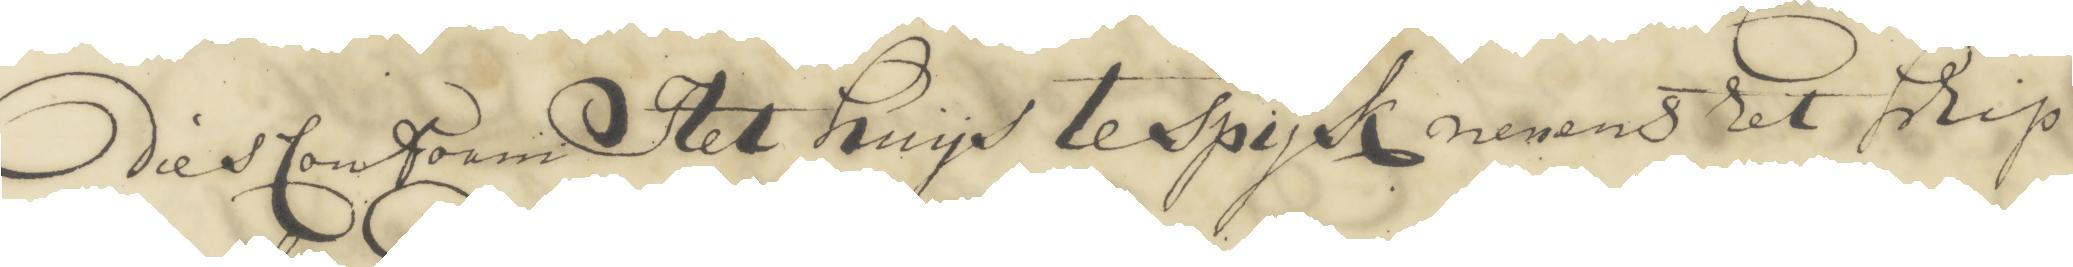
dies conform Het huijs te spijk nevens het schip
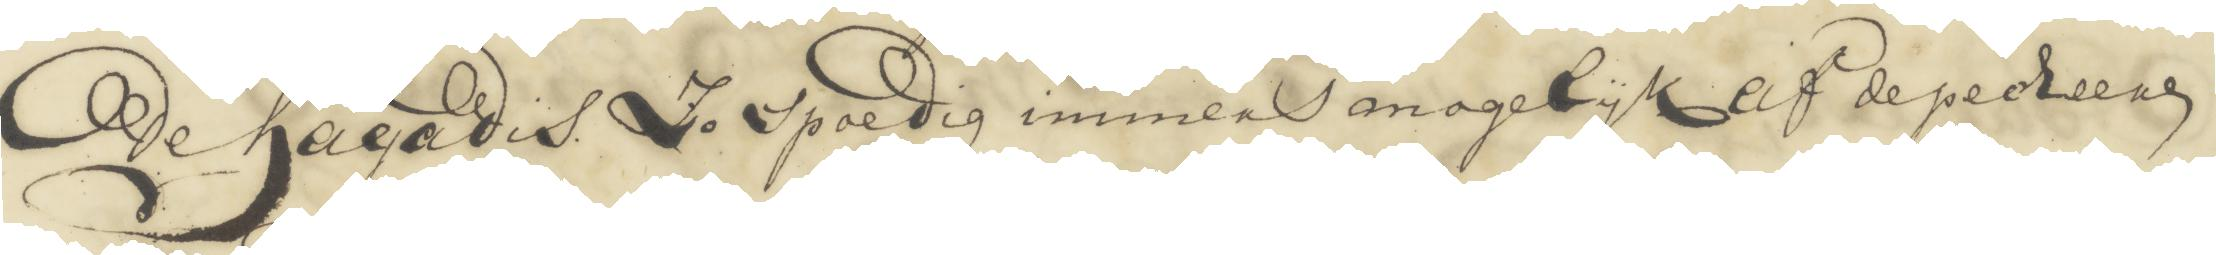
de hagadis zo spoedig immers mogelijk af depecheeren
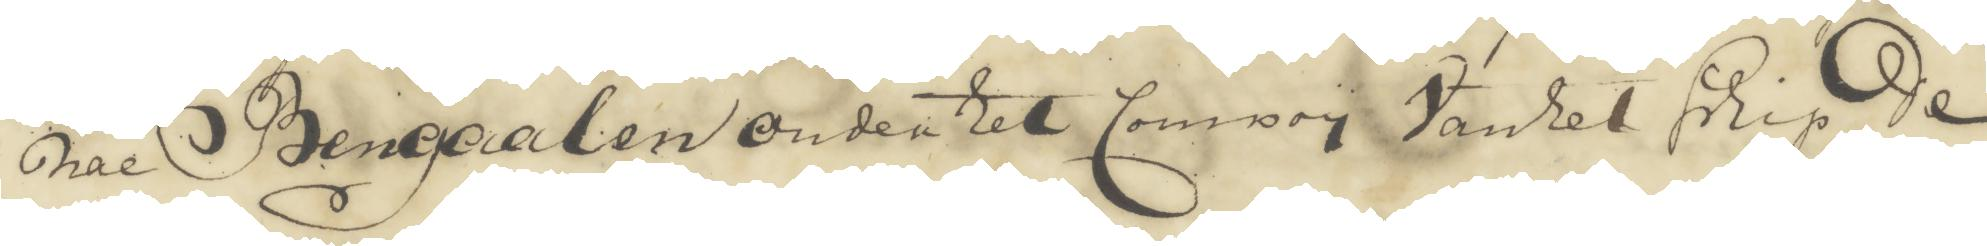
nae Bengaalen onder het Comvoij van het schip de
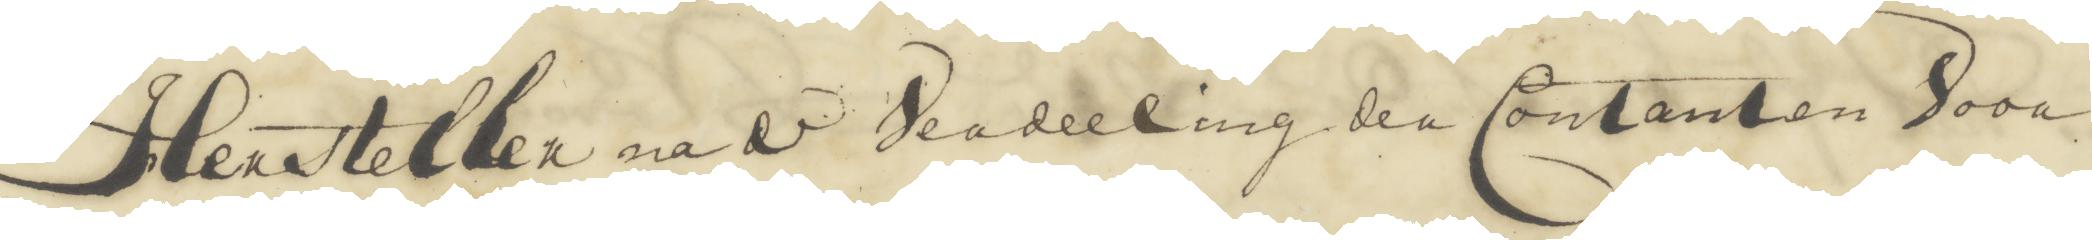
Hersteller na de verdeeling der Contanten voor
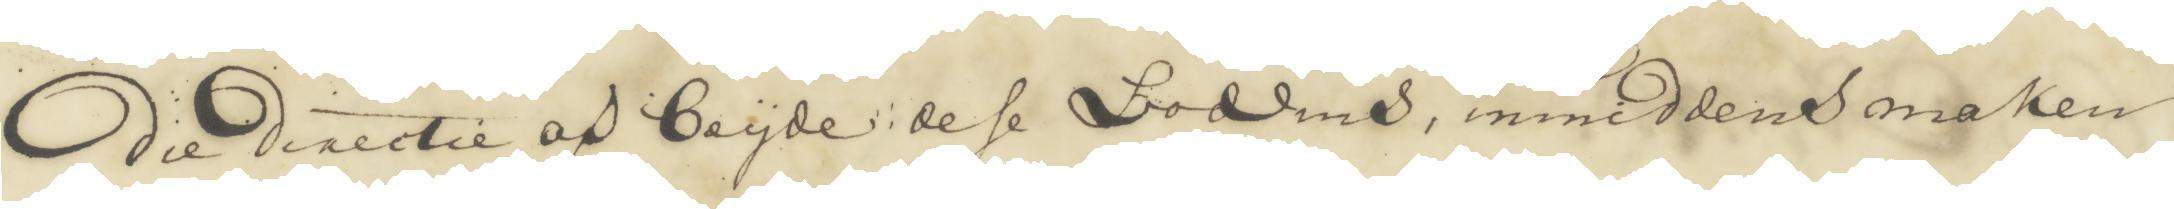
die directie over beijde dese bodems, in middens maken
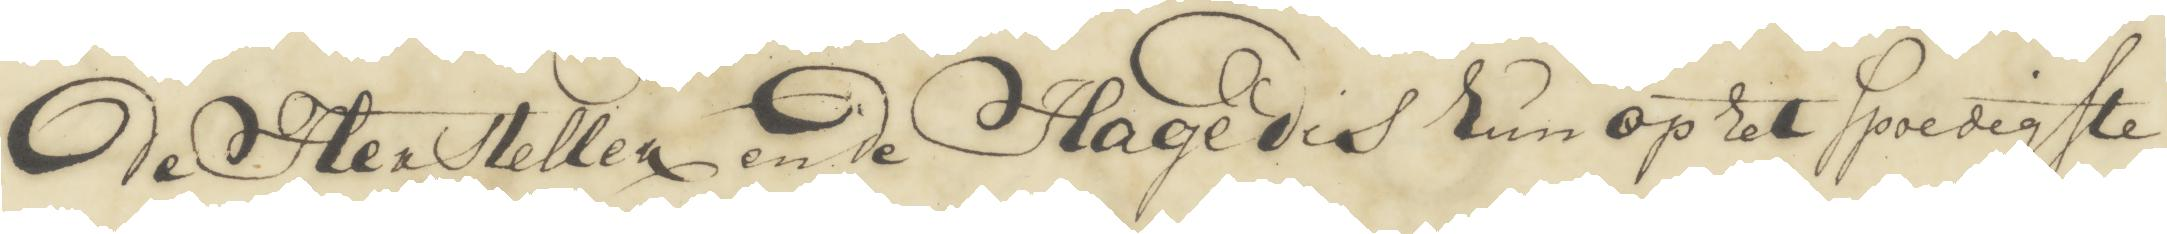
de Herstellen en de Hagedis hun op het spoedigste
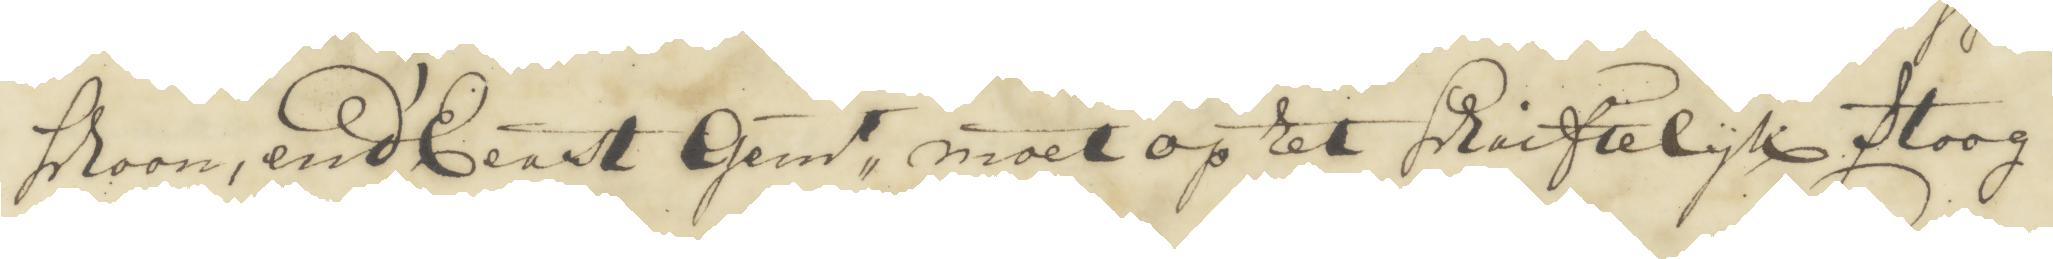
schoon, en d' Eerst gem„t moet op het schriftelijk vertoog
